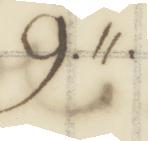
9. „
